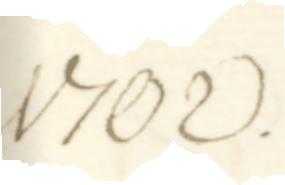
1702.
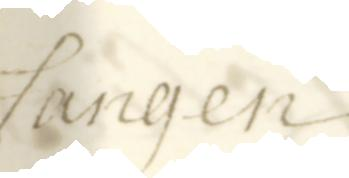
langen
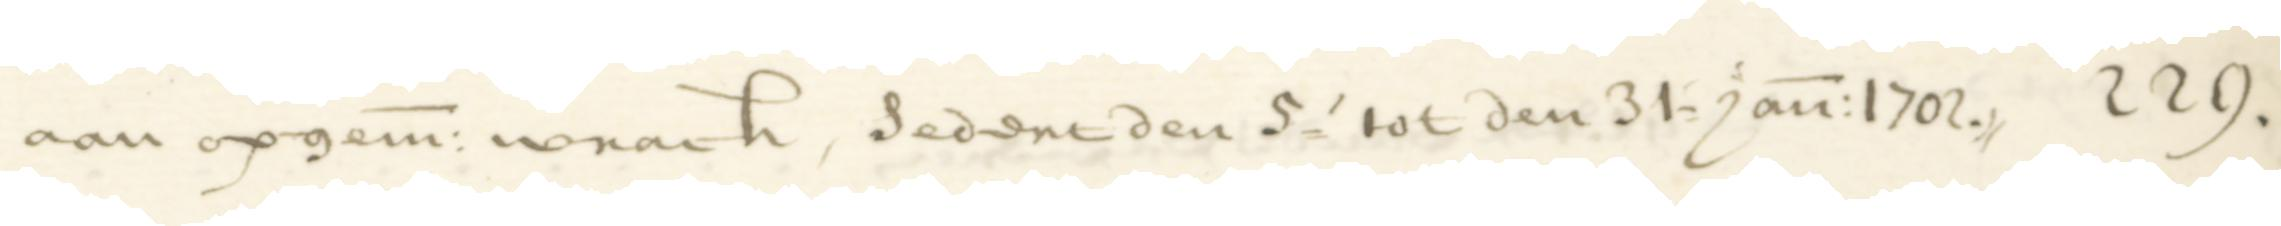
aan op gem: wrack, sedert den 5=' tot den 31=' jan: 1702.„ 229.
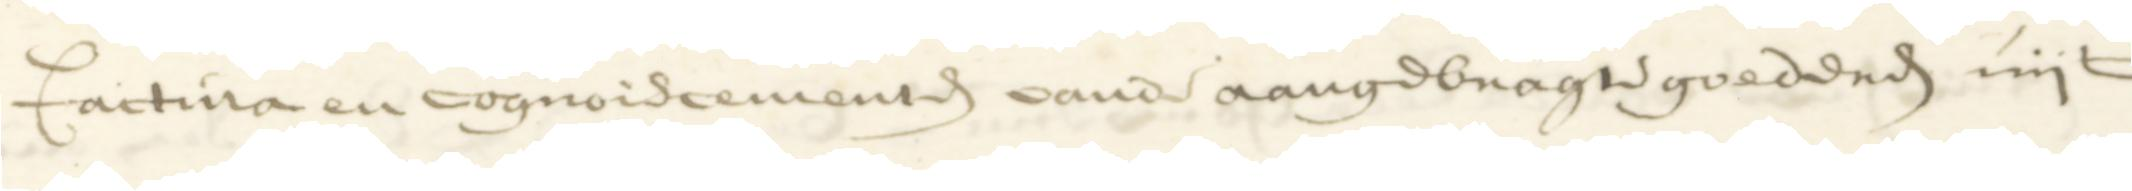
factura en cognoiscementen van de aangebragte goederen uijt
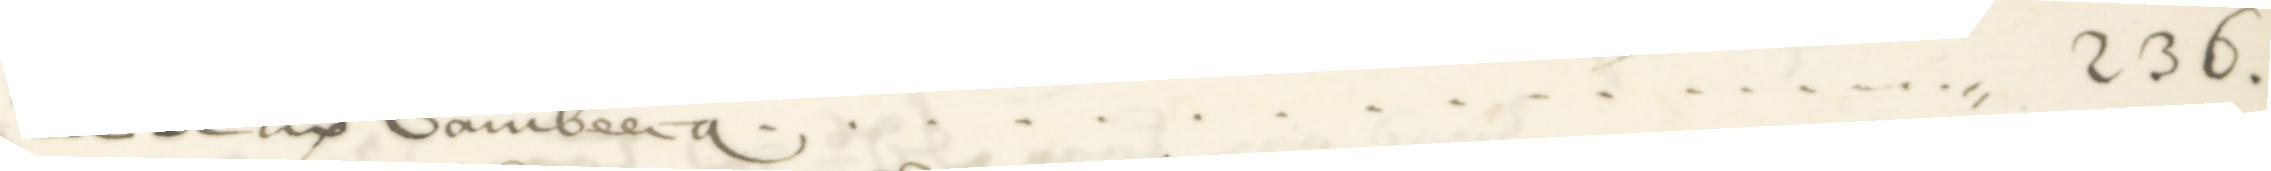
het schip bambeecq . . . . . . . . . . . . . . . . . „ 236.
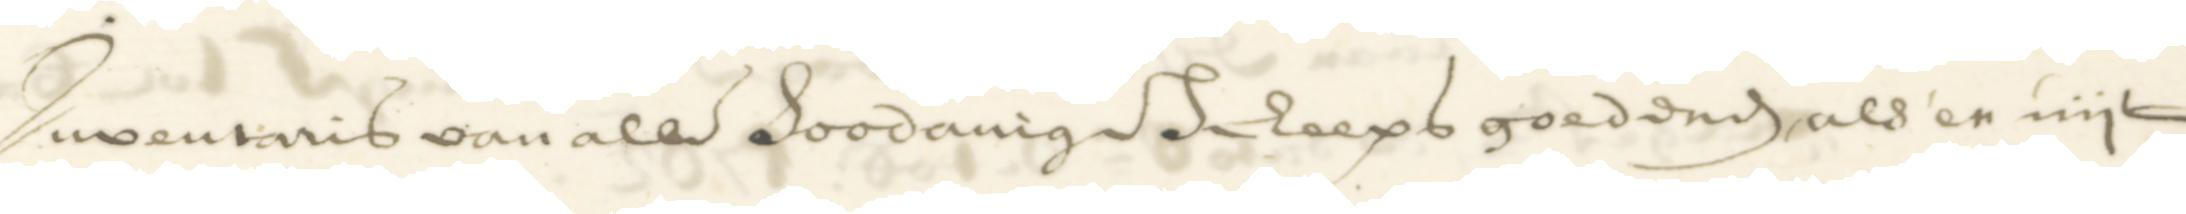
Jnventaris van alle soodanige scheeps goederen, als 'er uijt
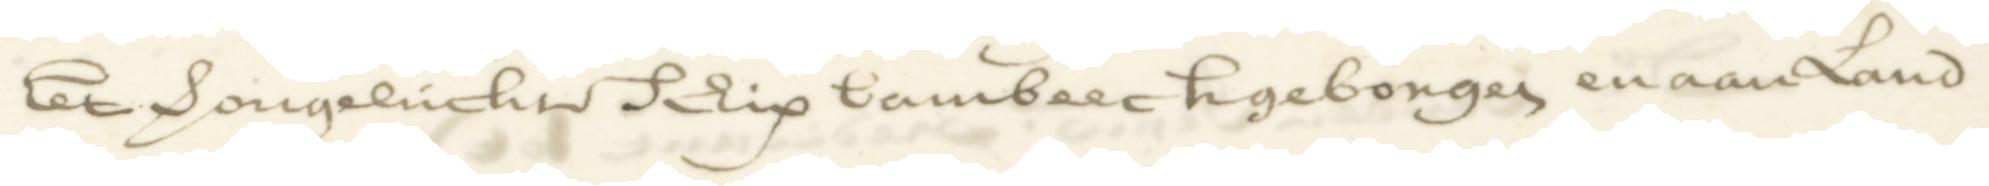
het verongeluckte schip bambeeck geborgen en aan land
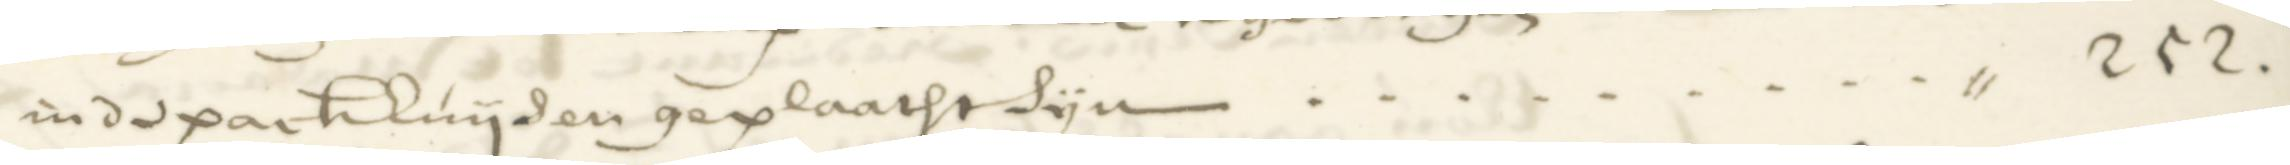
in de packhuijsen geplaatst sijn . . . . . . . . . „ 252.
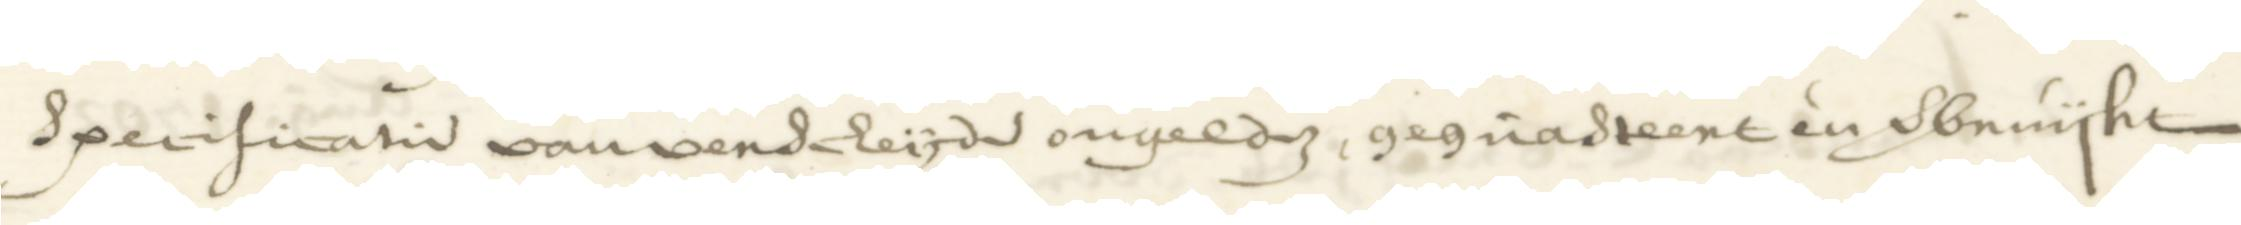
specificatie van verscheijde ongelden, geguasteert en verbruijkt
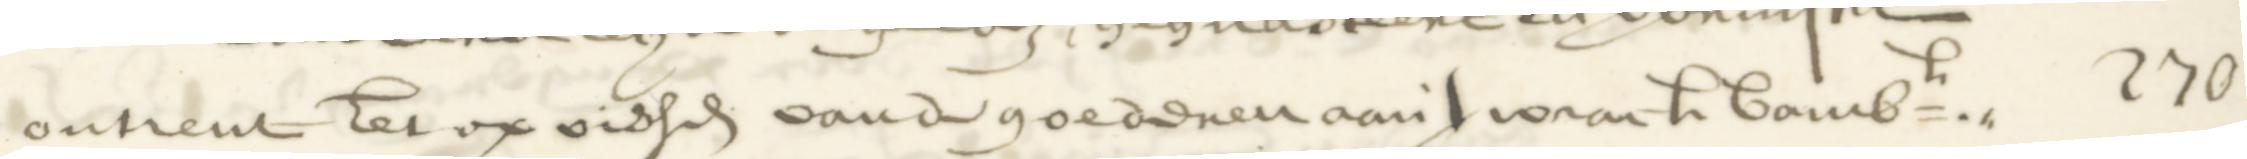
ontrent het op vissen van de goederen aan ’t wrack bamb=k.„ 270
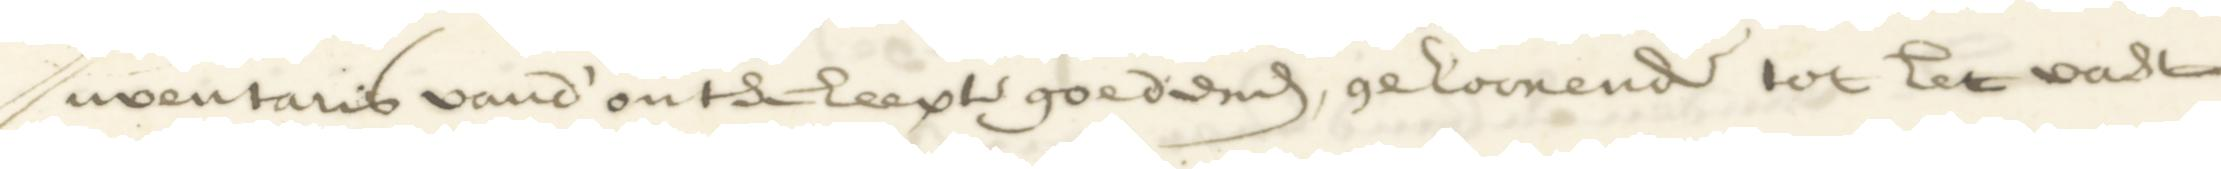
Jnventaris vand’ ontscheepte goederen, gehoorende tot het vast
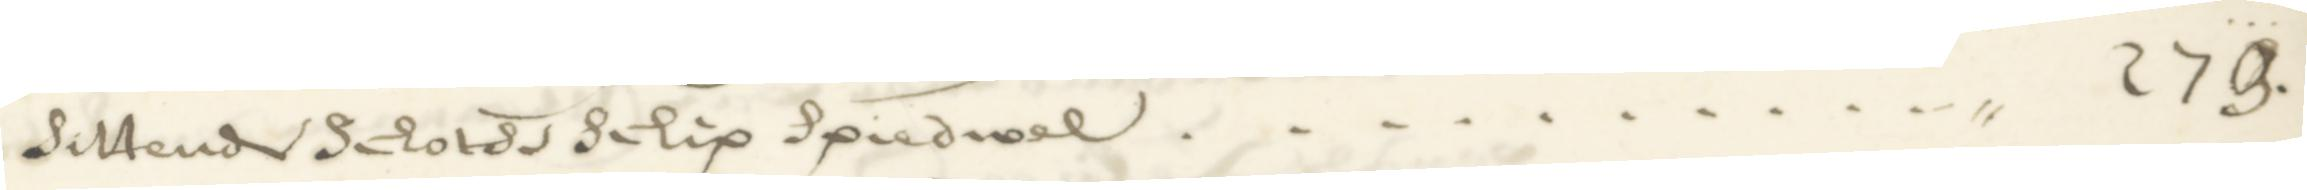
sittende schotse schip spiedwel . . . . . . . . . . „ 279.
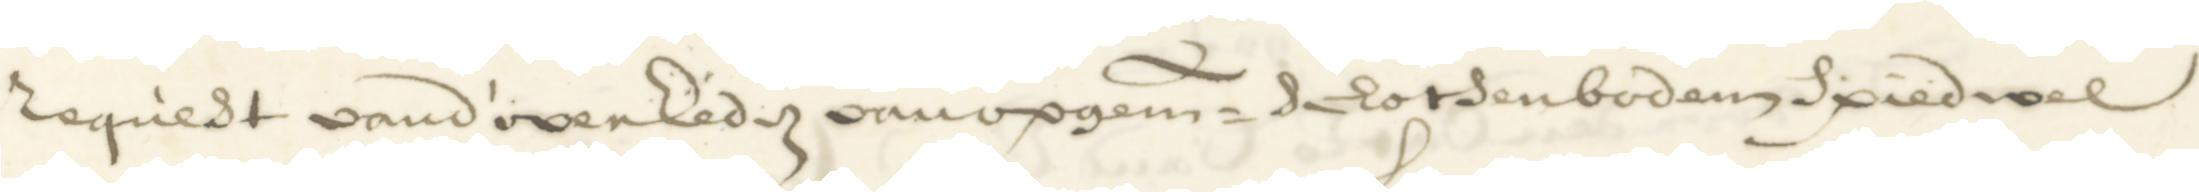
request van d’ overheden van opgem= schotsen bodem spiedwel
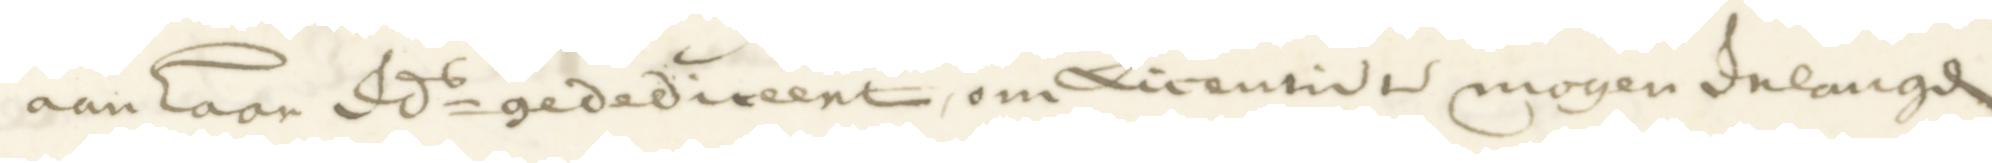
aan haar Ed=s gedediceert, om licentie te mogen Erlangen
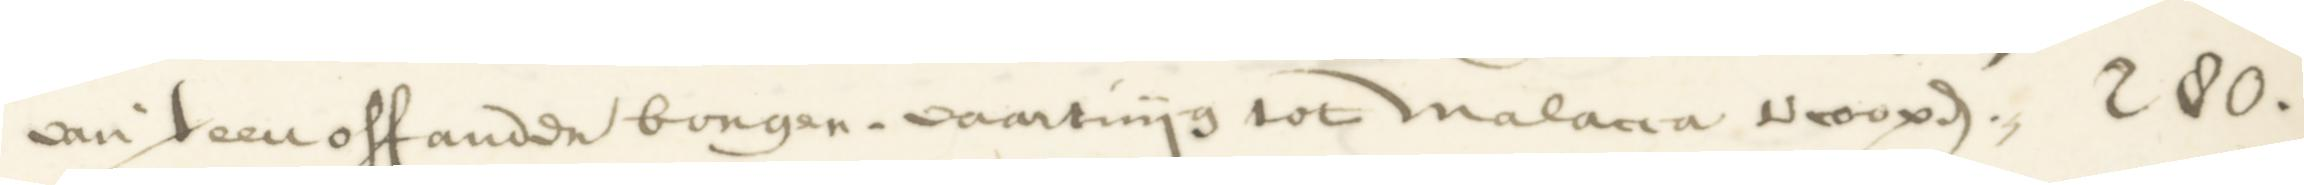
van 't een off ander borger-vaartuijg tot malacca te coopen.„ 280.
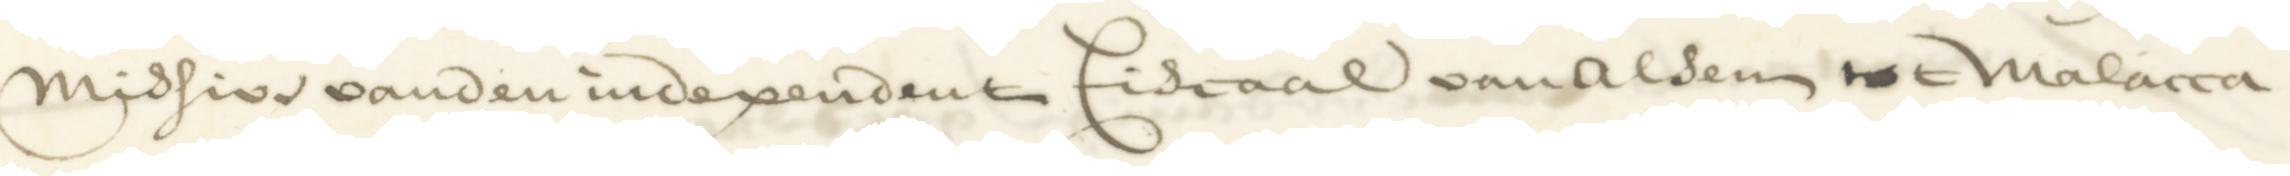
Missive van den independent Fiscaal van Alsem tot Malacca
